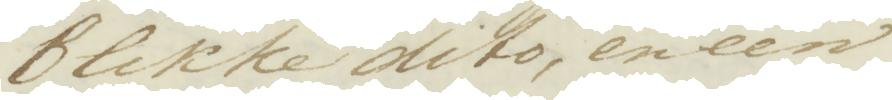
blikke dito, en een
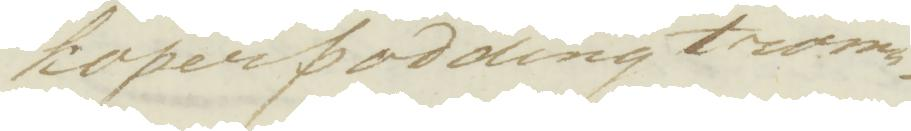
koper podding trom„
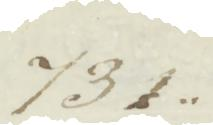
731 „ —
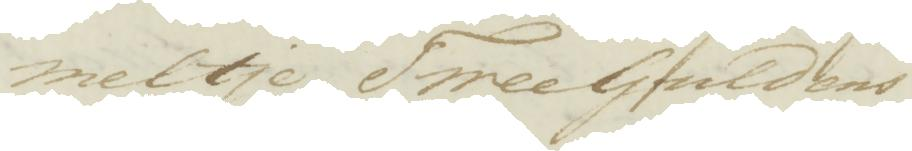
meltje, Twee Guldens
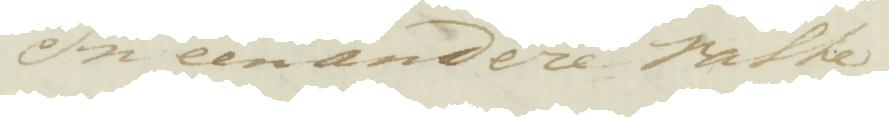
In een andere vaste
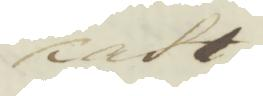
kast.
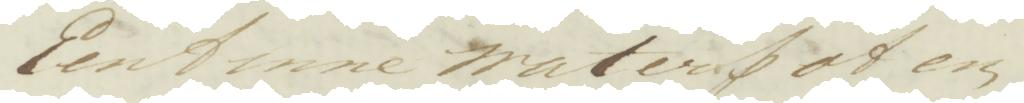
Een tinne waters of en
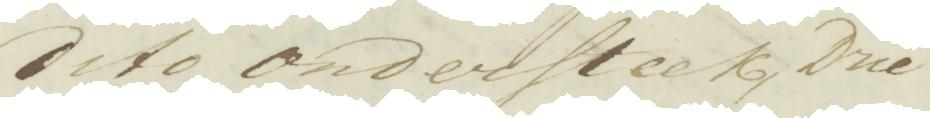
dito ondersteek, drie
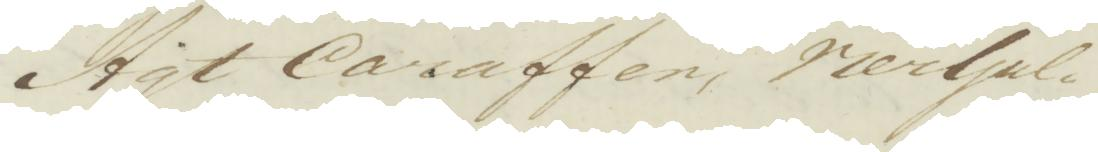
Agt caraffen, vier Gul
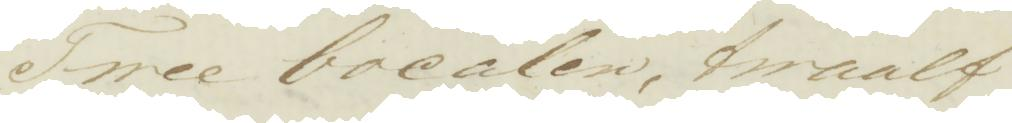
Twee bocalen, twaalf
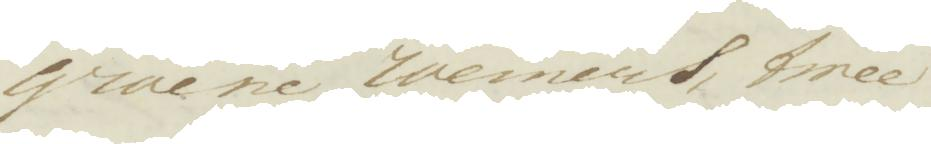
Groene roemers, twee
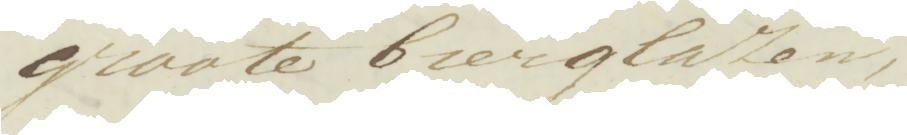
groote bierglazen,
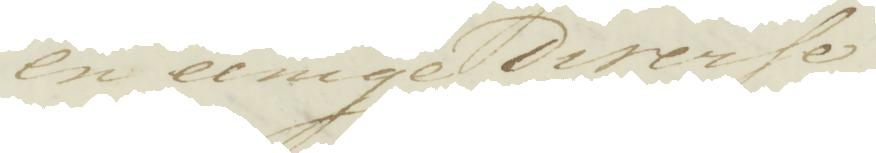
en eenige diverse
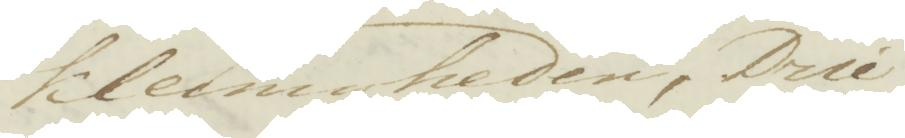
kleinigheden, Drie
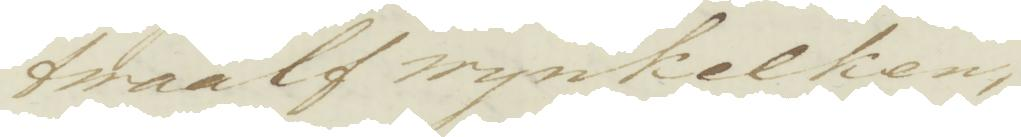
twaalf wynkelken,
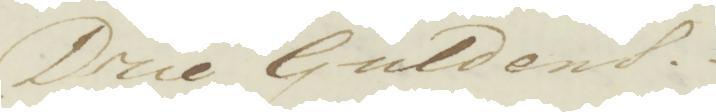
Drie Guldens.
